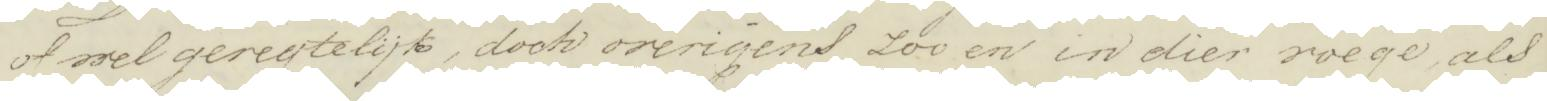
of wel geregtelijk, doch overigens zoo en in dier voege, als
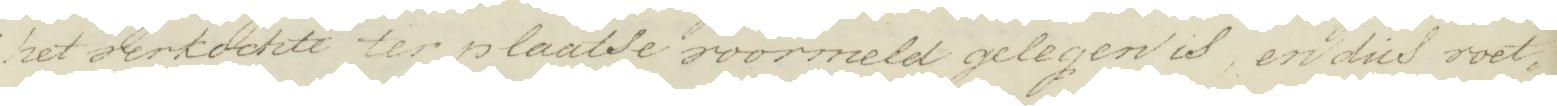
het verkochte ter plaatse voormeld gelegen is, en dus voet„
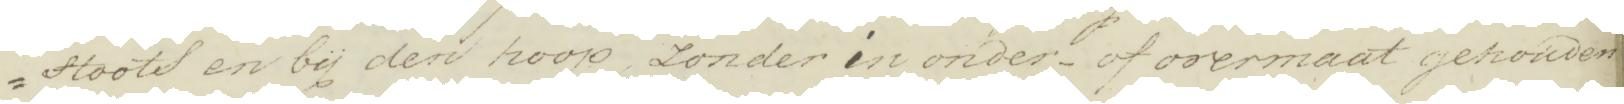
=stoots en bij den hoop, zonder in onder- of overmaat gehouden
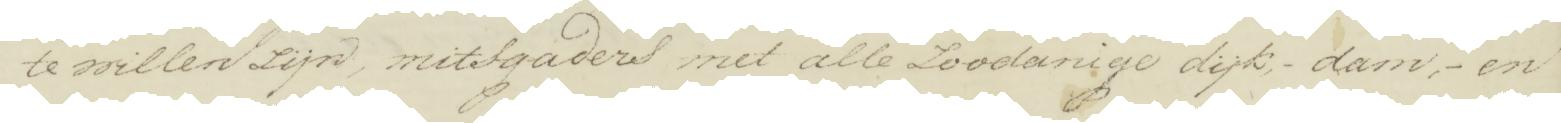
te willen zijn, mitsgaders met alle zoodanige dijk,- dam, - en
